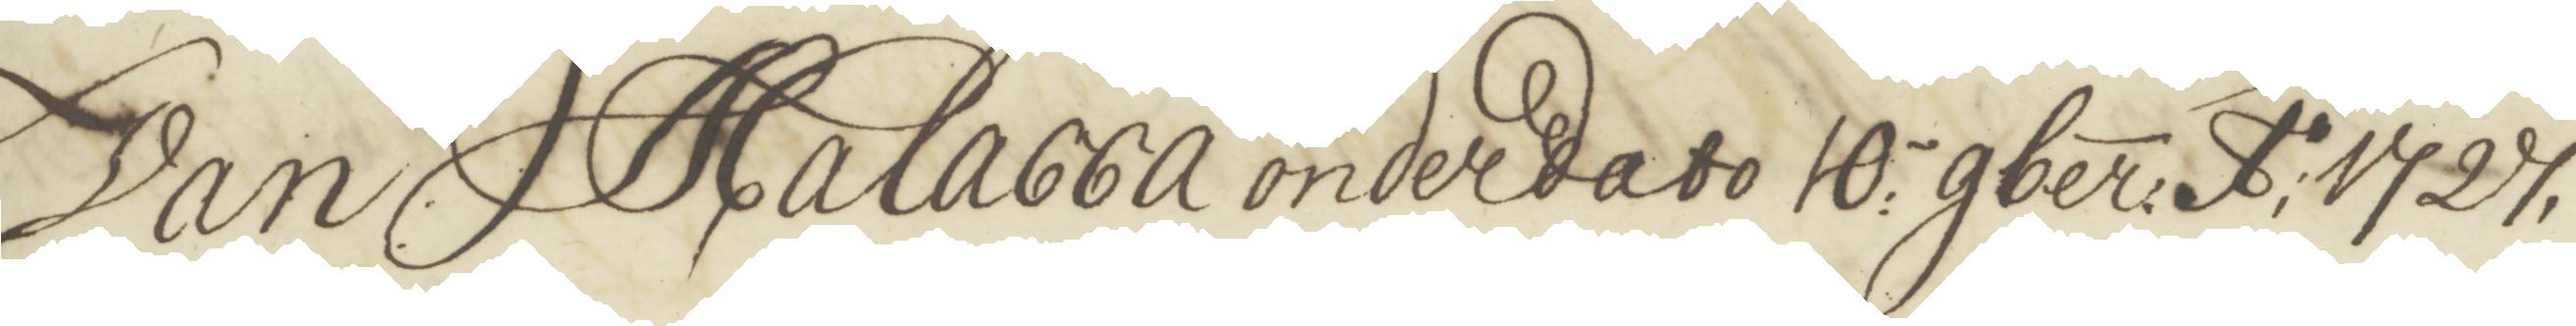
Van Malacca onder dato 10:' 9ber A:o 1727,
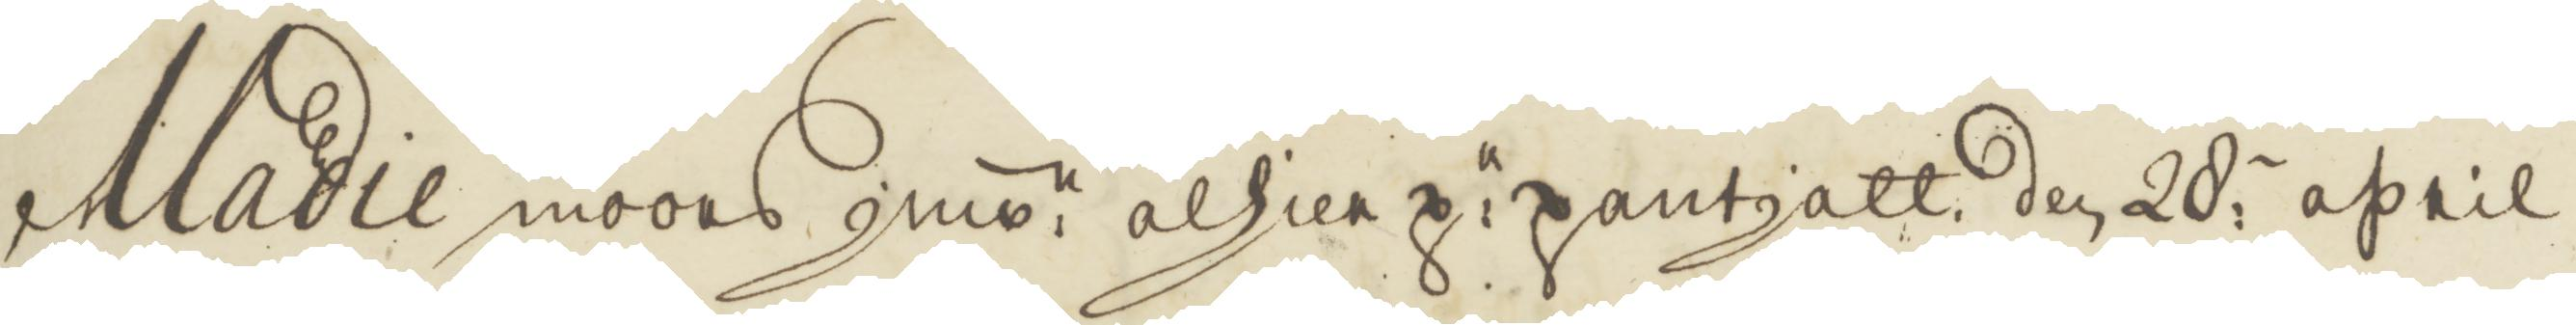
Madie moors jnw:r alhier p:r pantjall: 28:' april
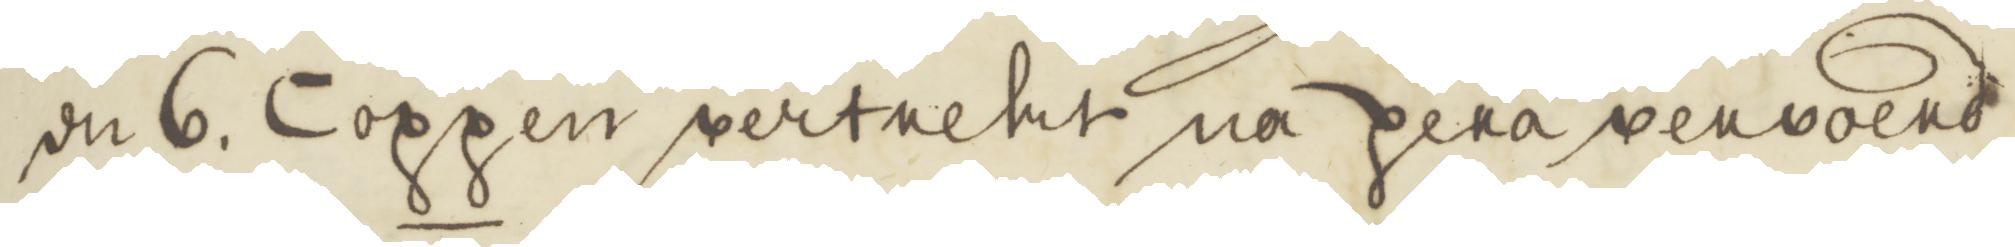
en 6. Coppen vertrekt na pera vervoerd
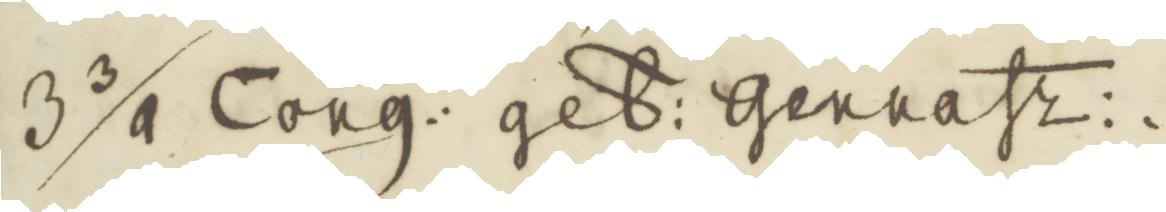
3¾ Corg: geb: gerrasz: . .
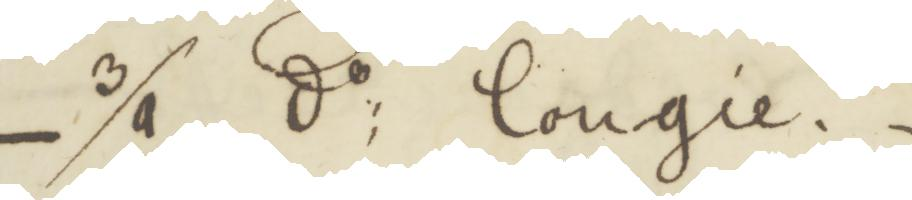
– ¾ d:o longie . . . . . . .
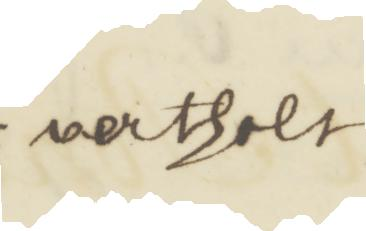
vertholt
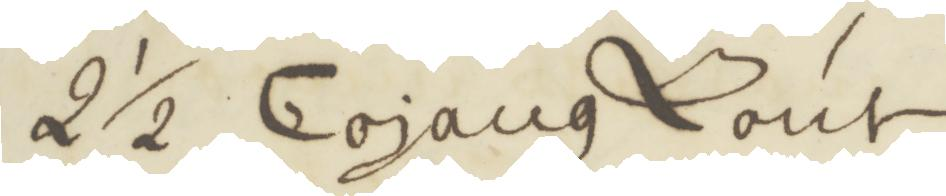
2½ Cojang zout . . . . . . .
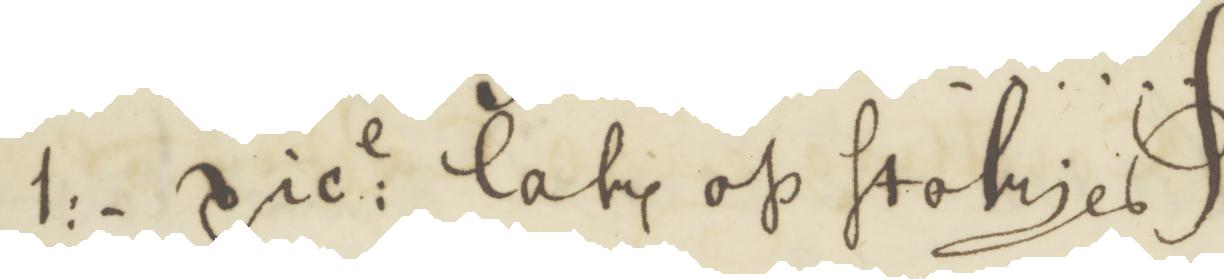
1:- pic:l lak op stokjes
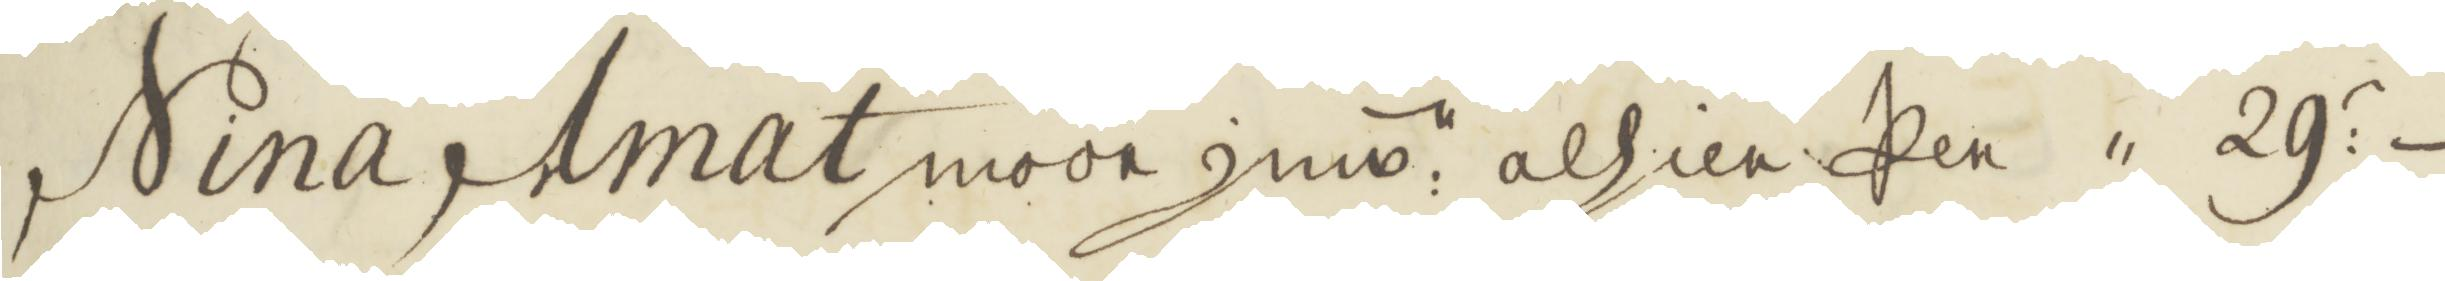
Nina Amat moor jnw:r alhier per „ 29:' _„o
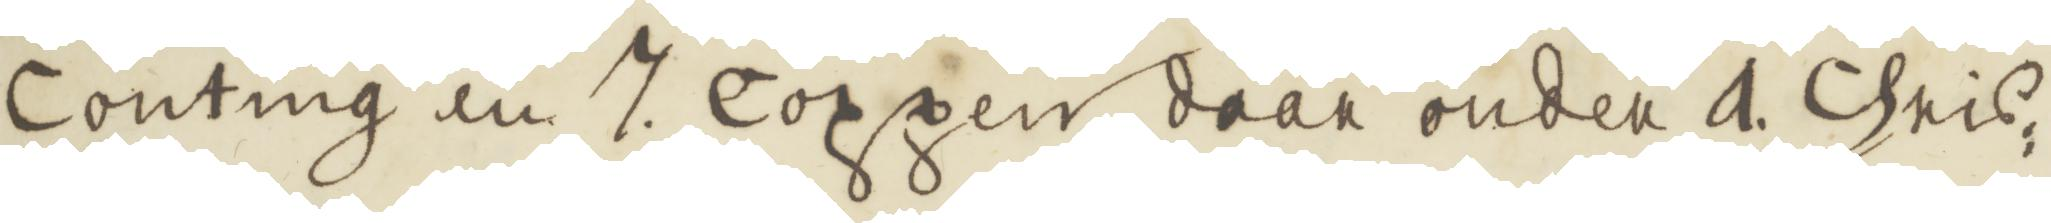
Conting en 7. Coppen daar onder 4. Chris„
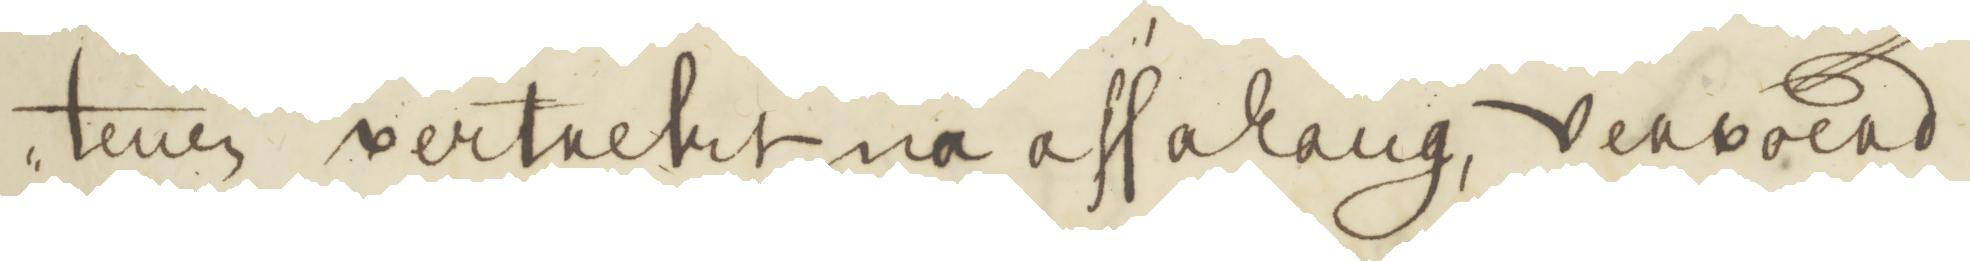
„tenen vertrekt na assahang, vervoerd
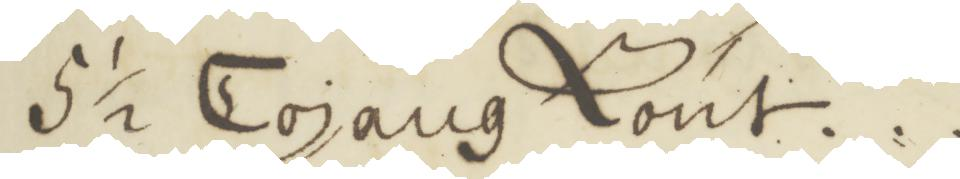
5½ Cojang zout . . . . .
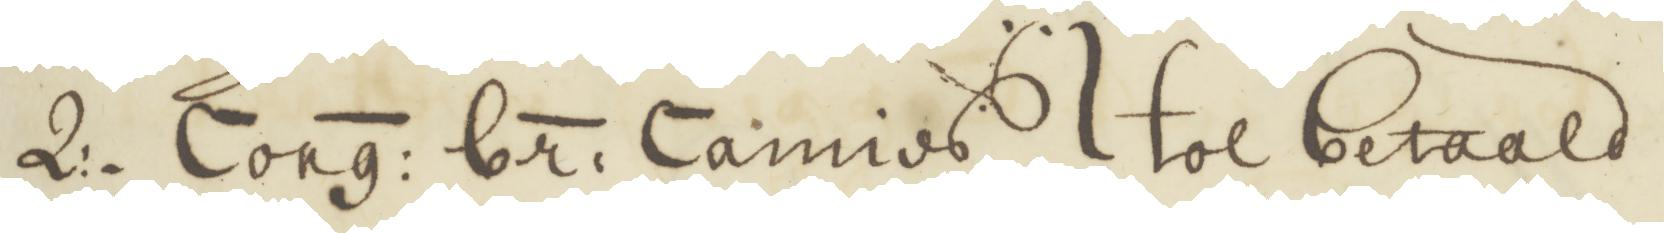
2:- Corg: br: Camies tol betaald
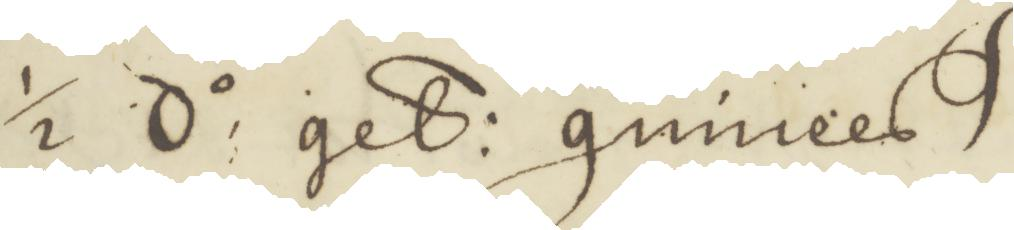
– ½ d:o geb: guinees
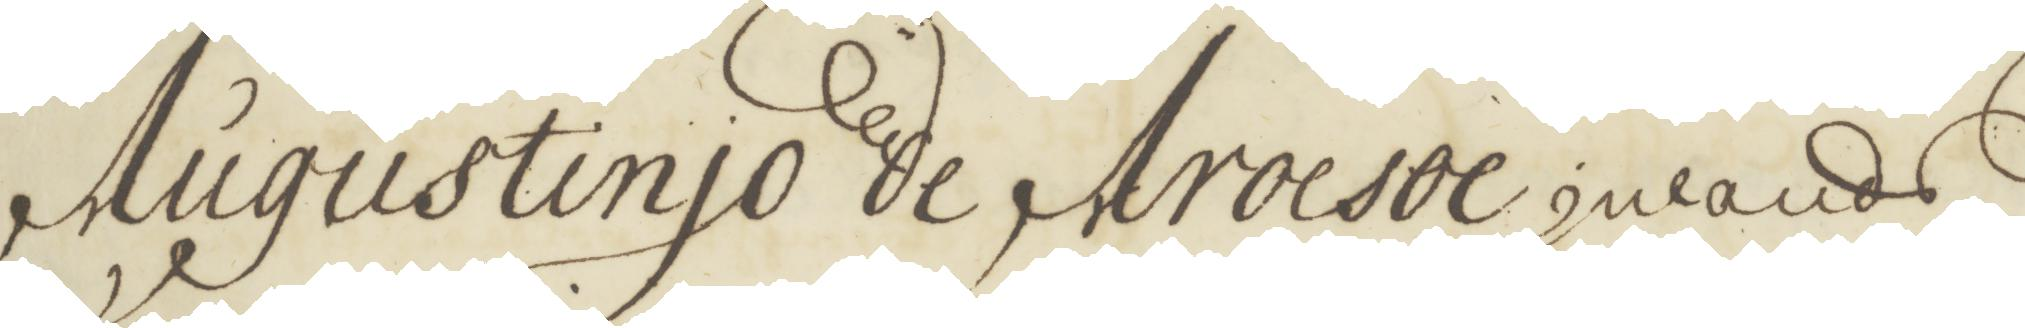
Augustinjo de Aroesoe jnlands „ d,o _„o
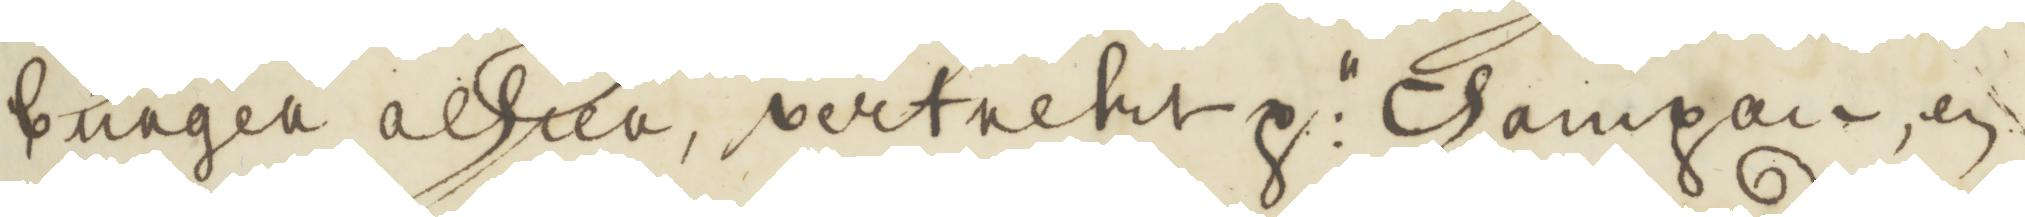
burger alhier, vertrekt p:r Champan, en
